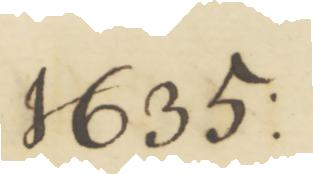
1635:
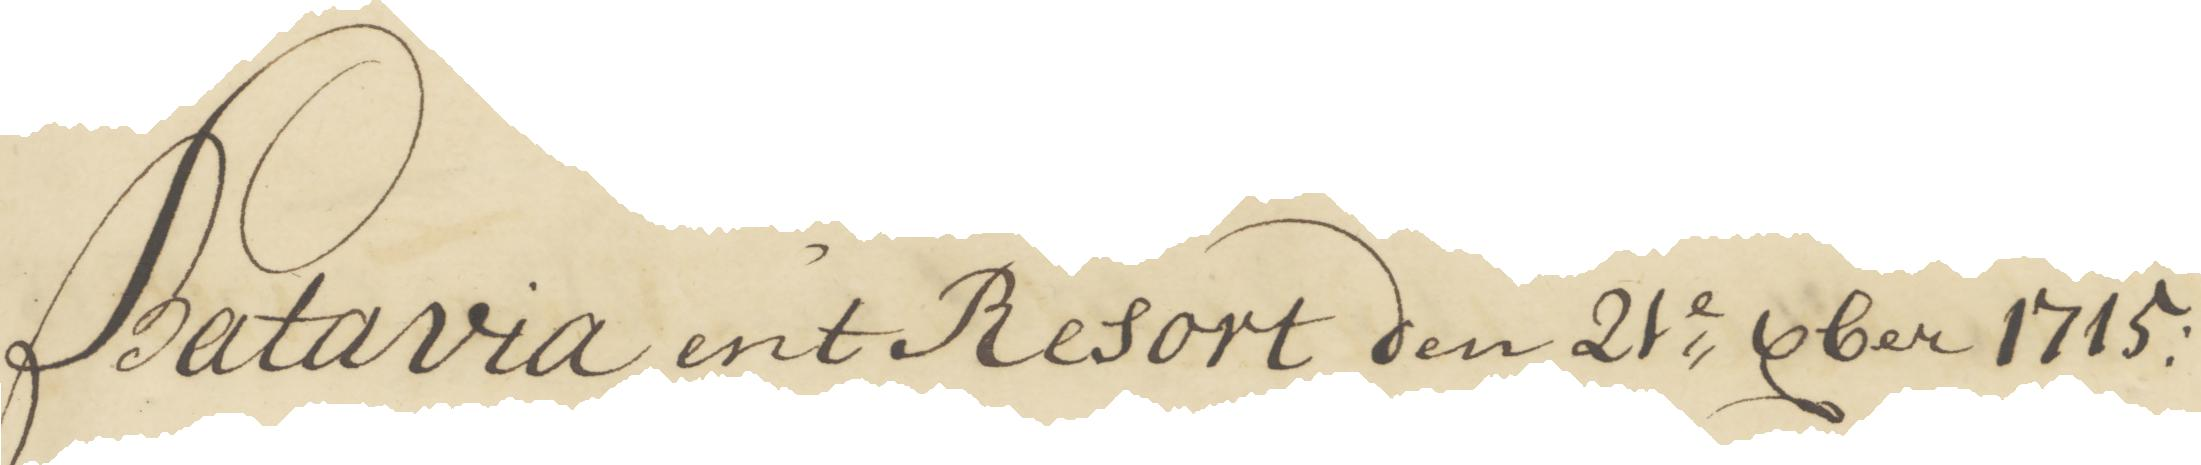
Batavia en’t Resort den 21„e xber 1715:
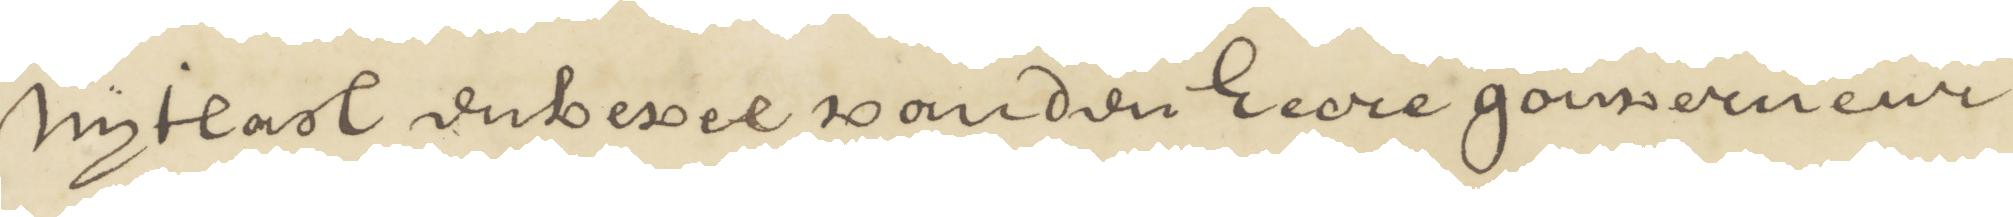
uijtlast enbevel van den heere gouverneur
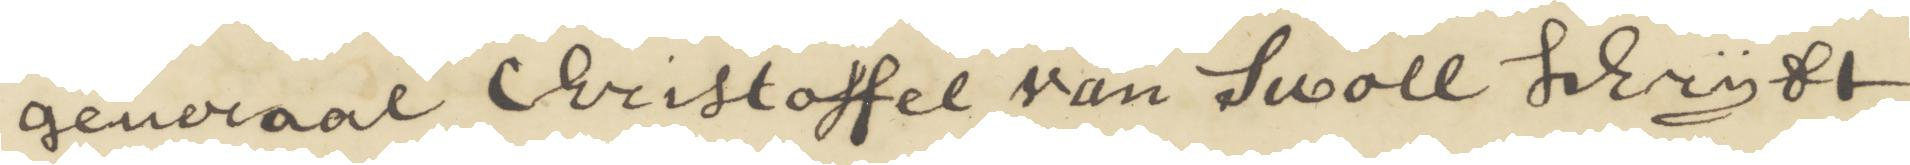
generaal Christoffel van Swoll schrijft
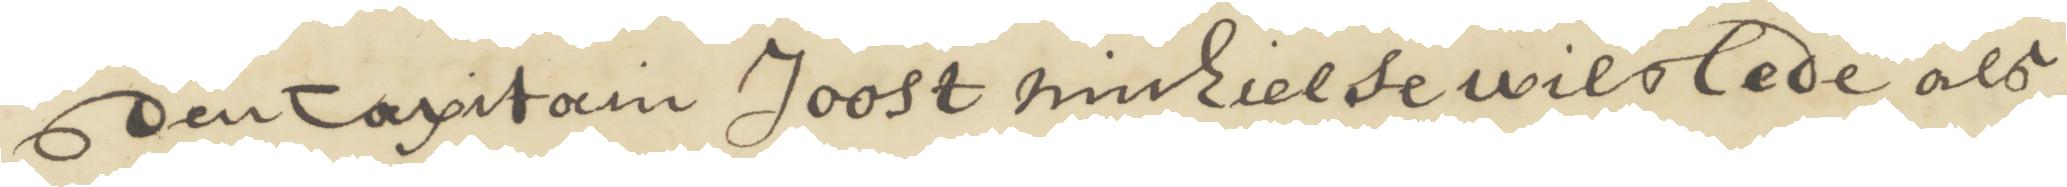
den Capitain Joost michielse wilstede als
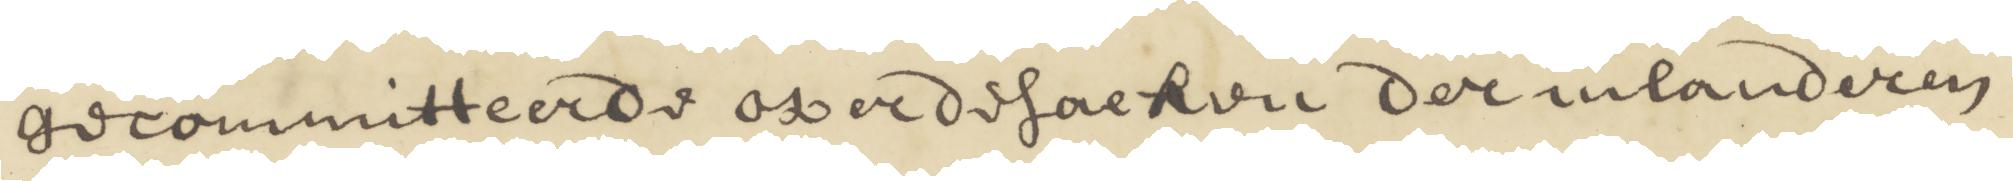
gecommitteerde over desaeken der inlanderen
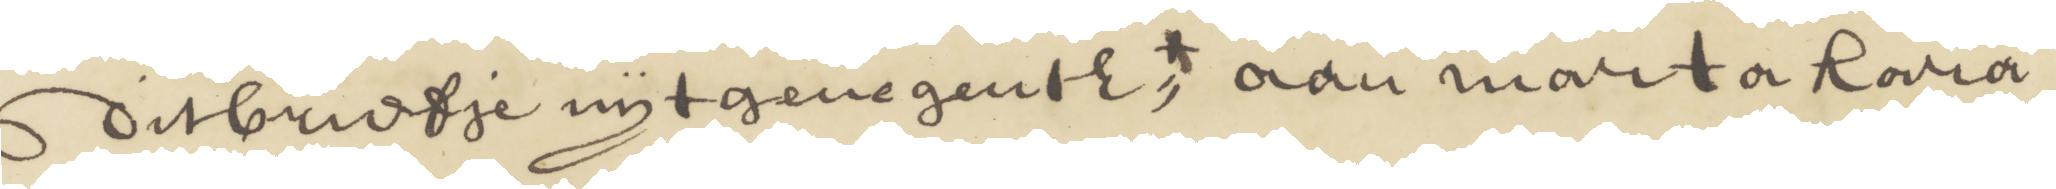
dit briefje uijt genegenth„t aan marta kara
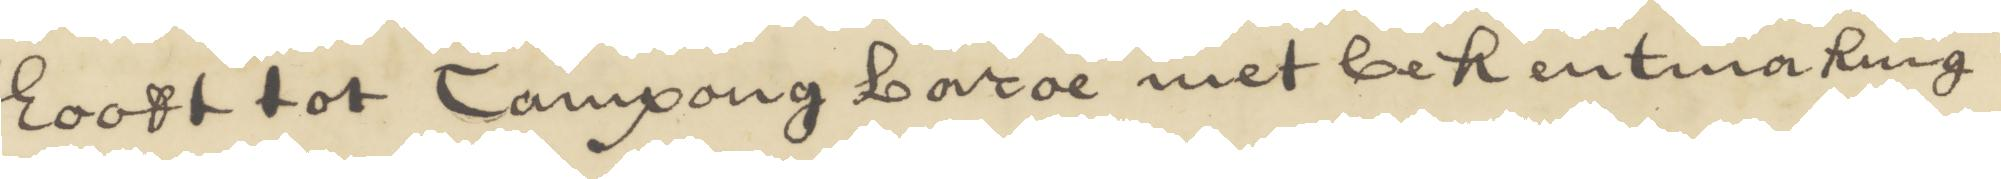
hooft tot Campong baroe met bekentmaking
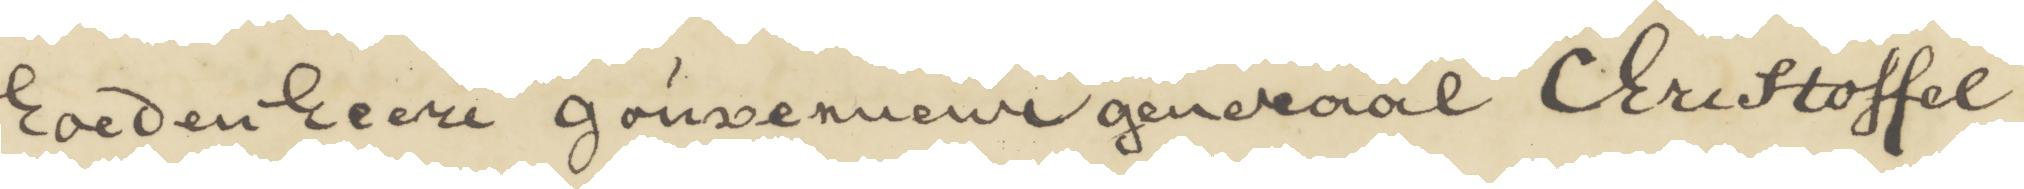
hoe den heere gouverneur generaal Christoffel
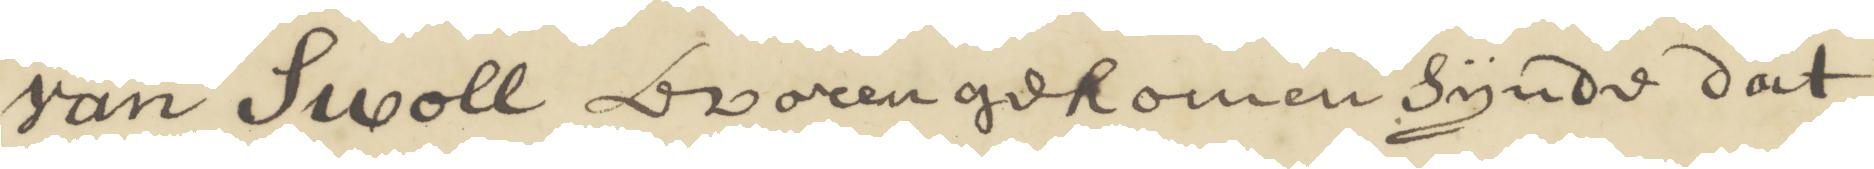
van Swoll tevoren gekomen sijnde dat
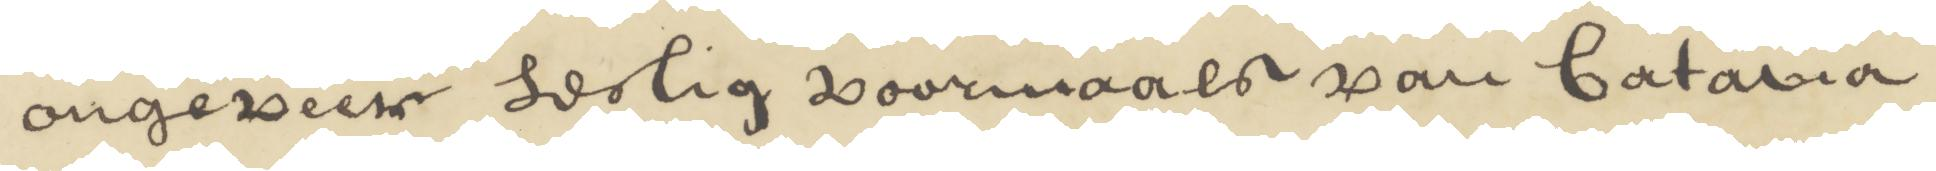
ongeveer sestig voormaals van batavia
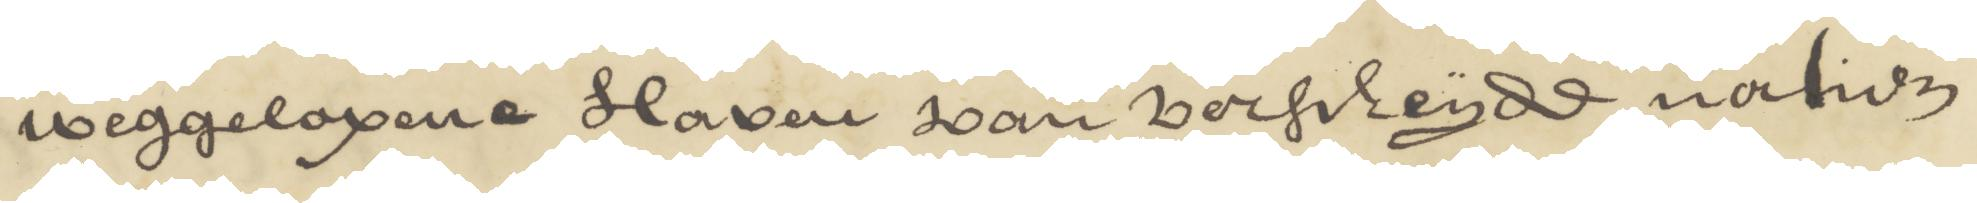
weggelopene slaven van verscheijde natien
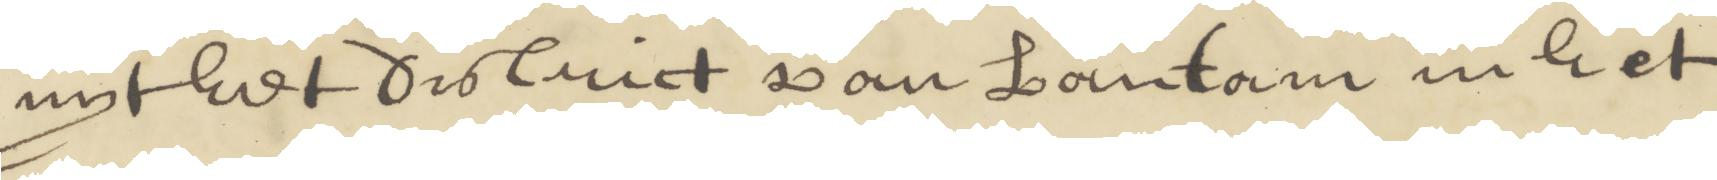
uijt het district van bantam in het
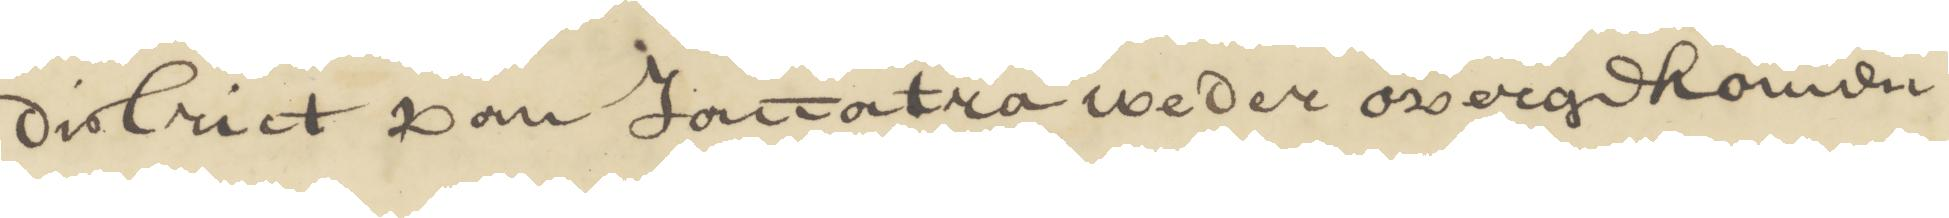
district van Jaccatra weder overgekomen
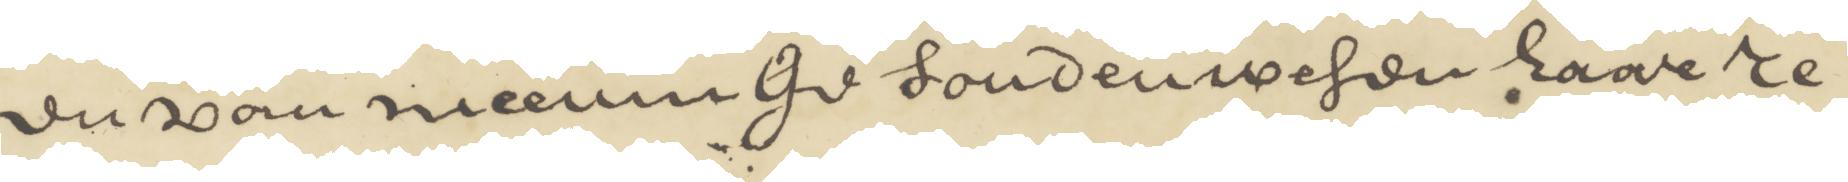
en van meeninge souden wesen haar re
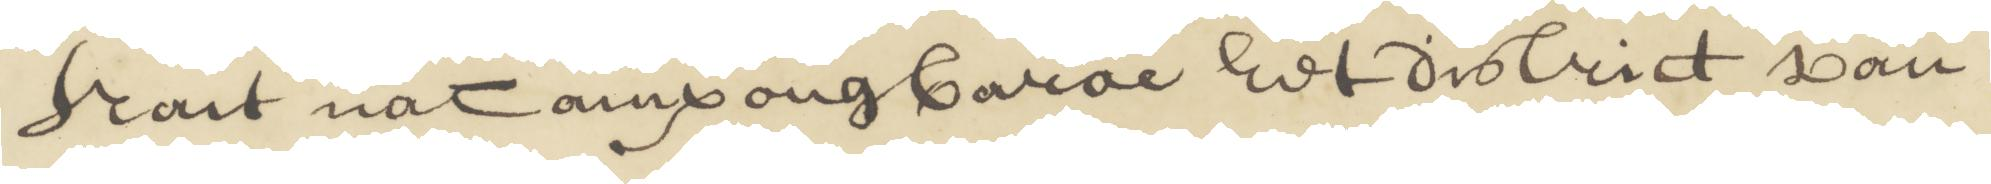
trait na campong baroe het district van
